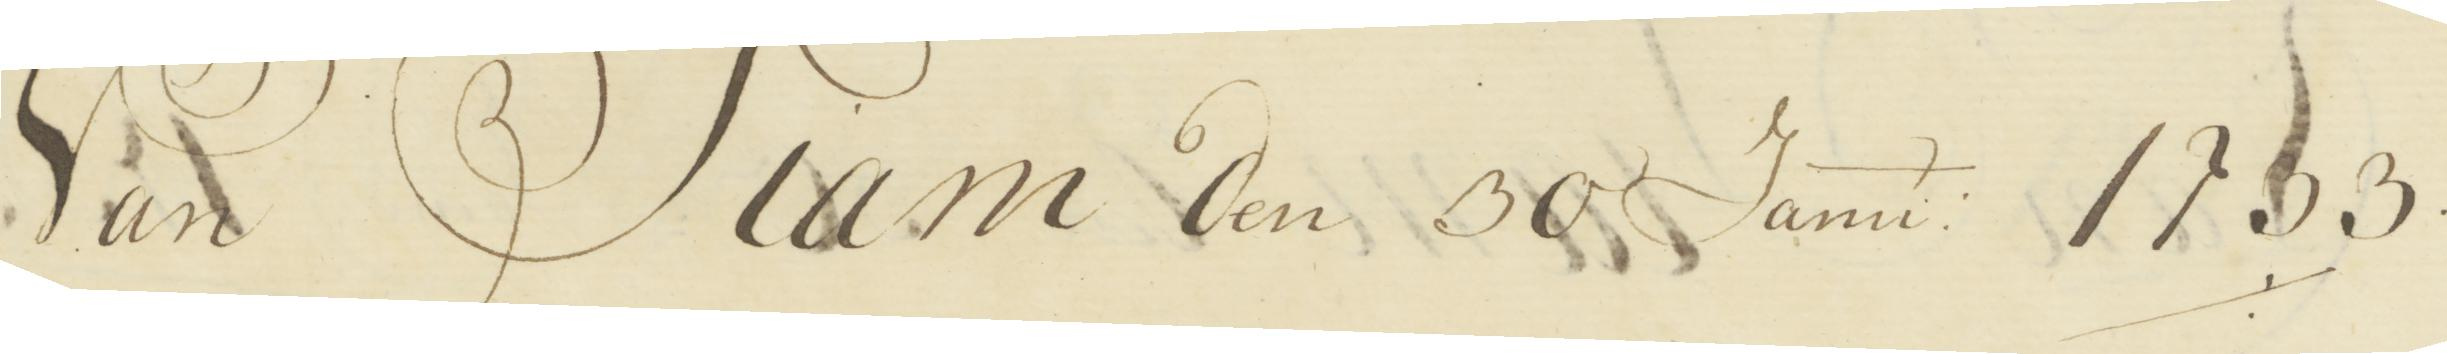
Van Siam den 30 Janu: 1733
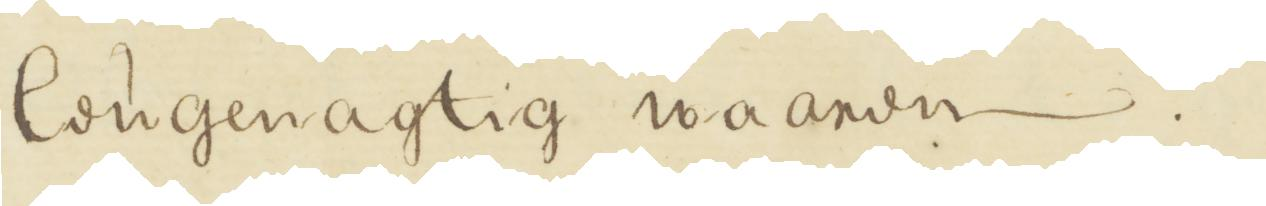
leugenagtig waaren.
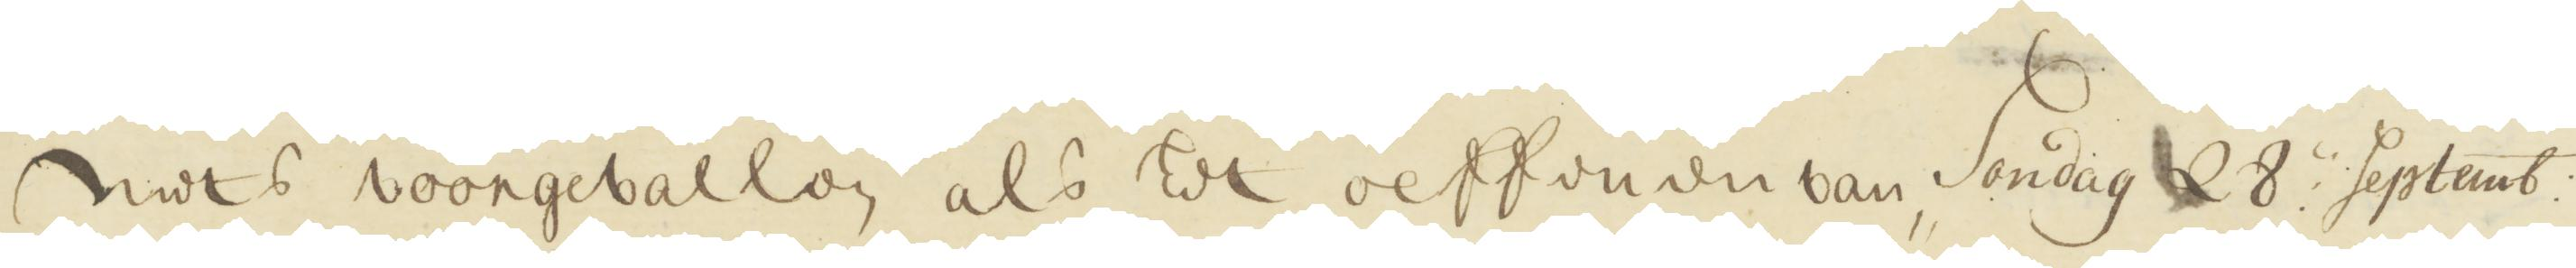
niets voorgevallen als het oeffenen van„ Sondag 28:' Septemb:
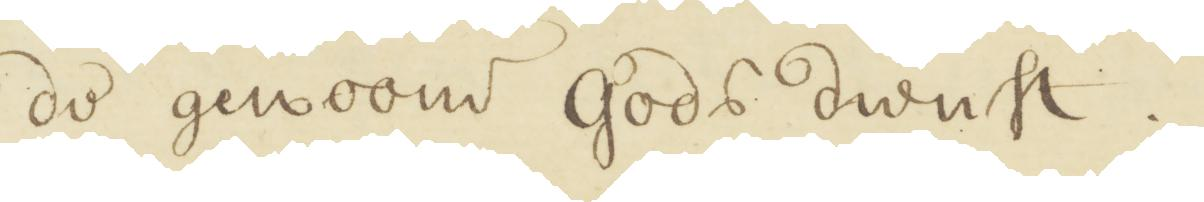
de gewoone gods dienst.
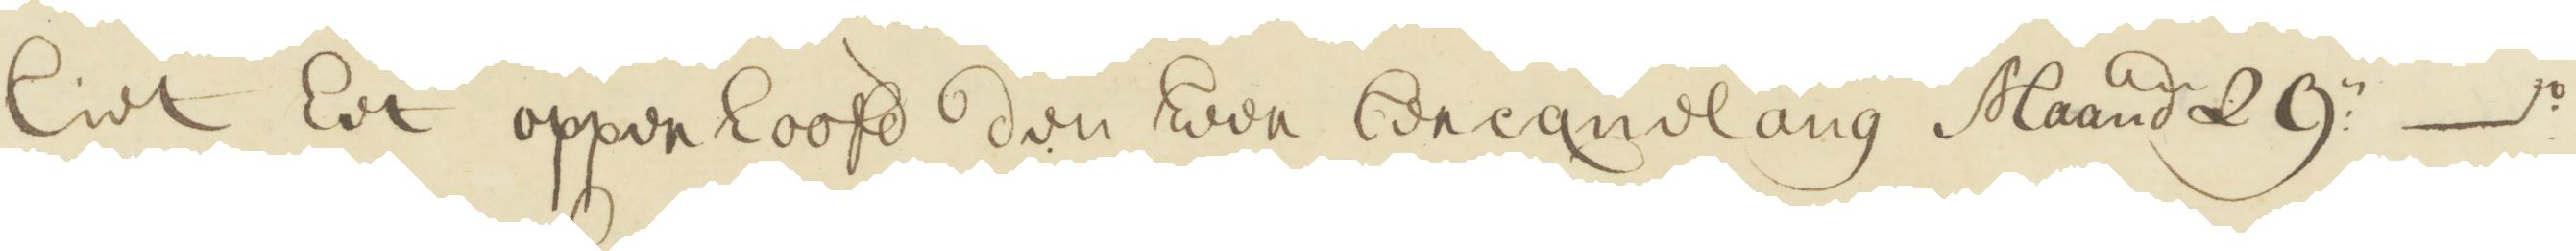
liet het opperhoofd den heer bercquelang Maand: 29:n _„o
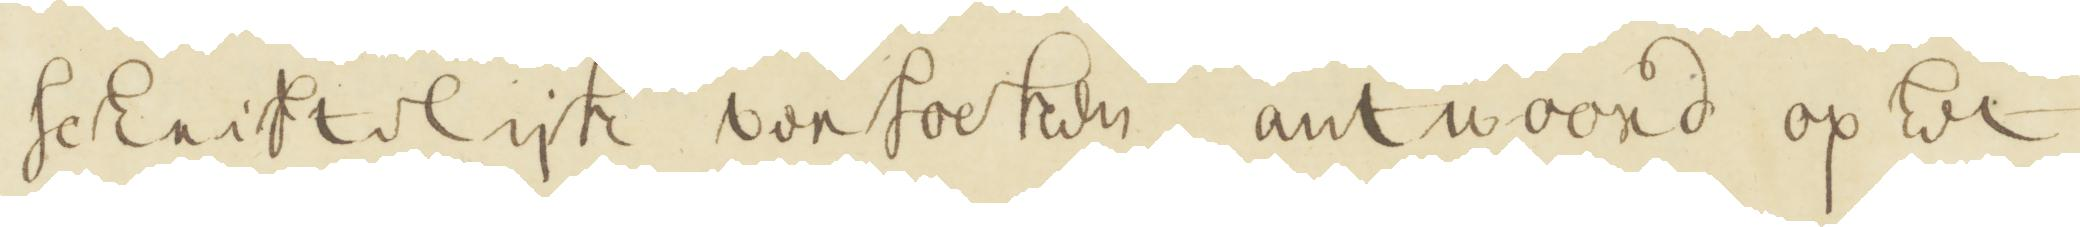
schriftelijk versoeken, antwoord op het
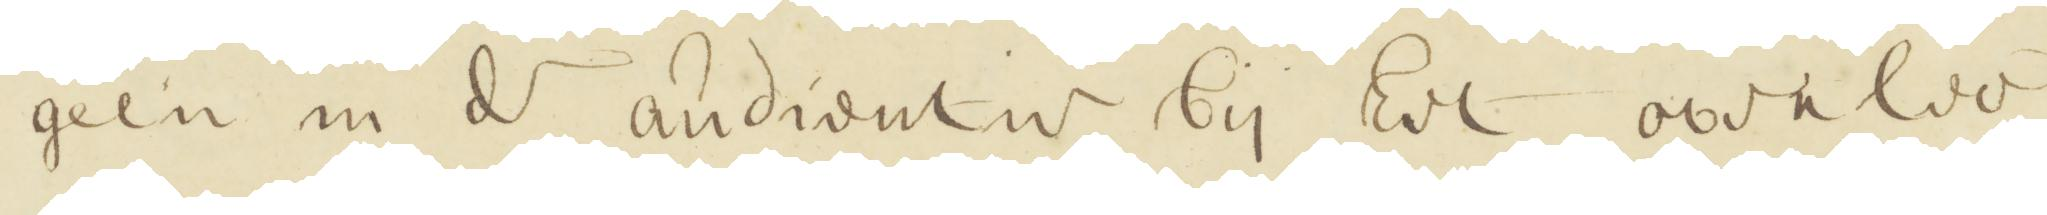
geen in de audientie bij het overlee
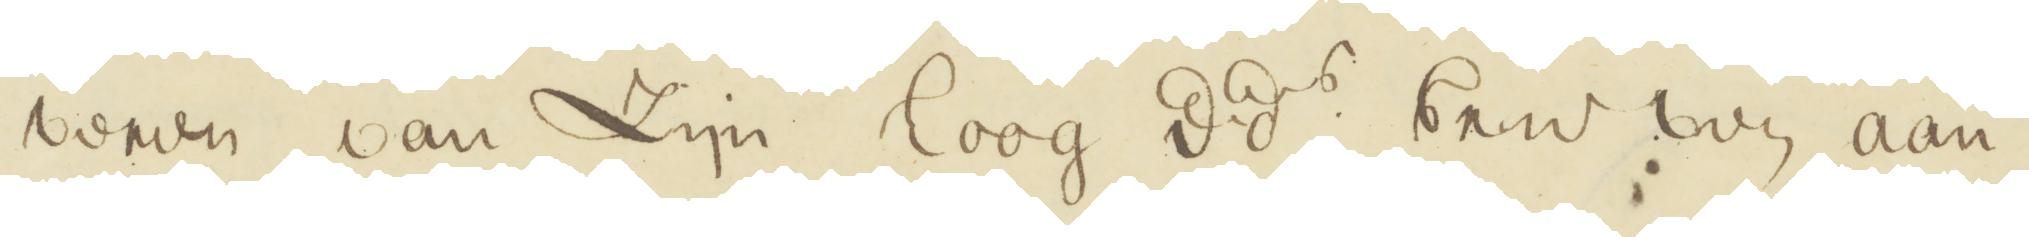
veren van Zijn hoog Ed:s brieven aan
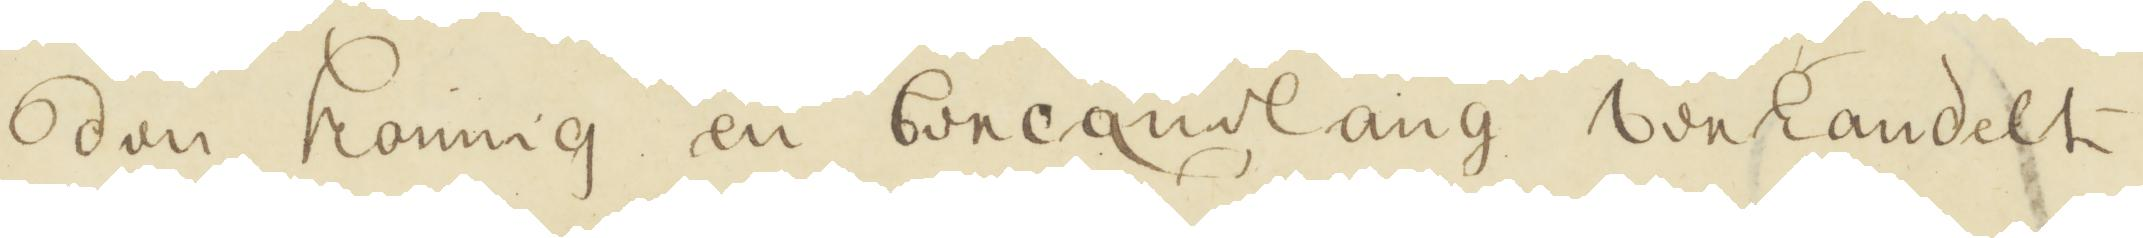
den koning en bercquelang verhandelt
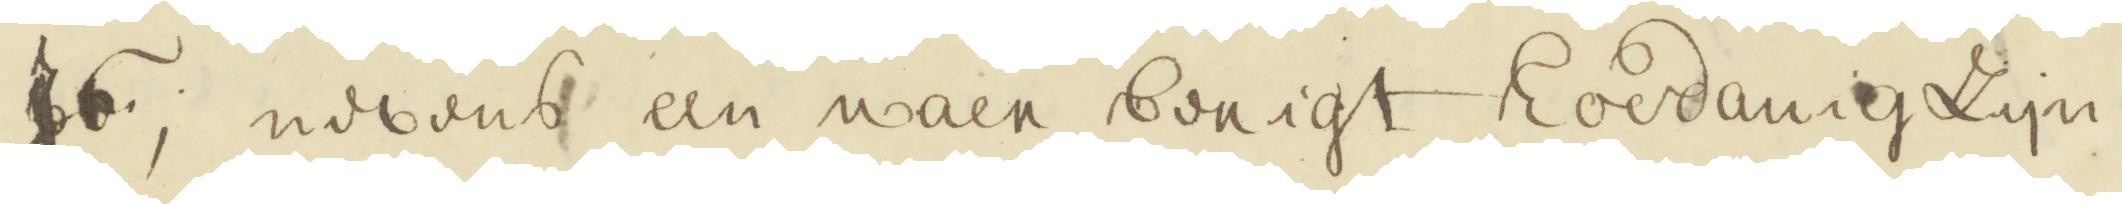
Js; nevens een waer berigt hoedanig Zijn
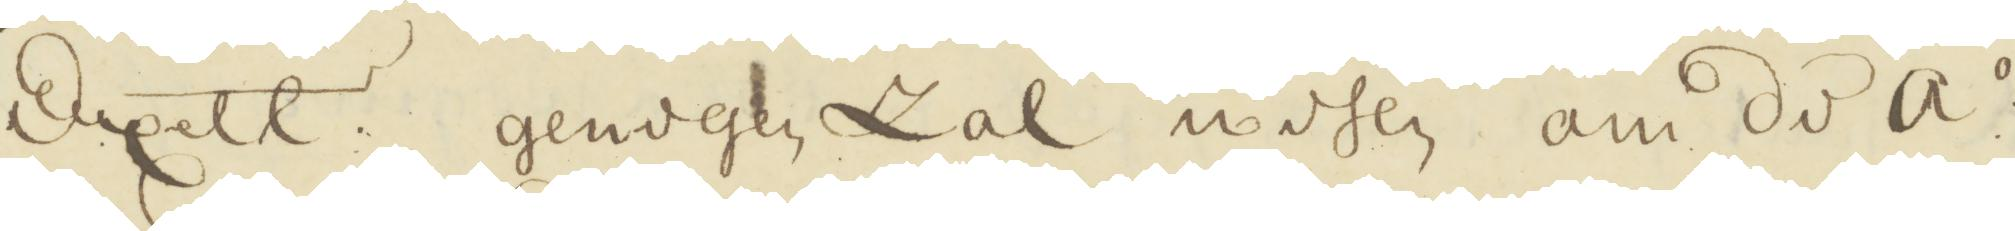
Exell: genegen Zal wesen om de A:o
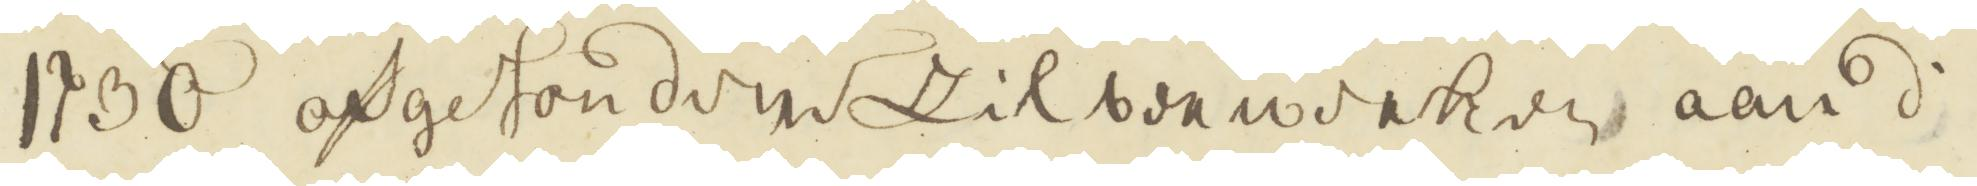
1730 overgesondene zilverwerken aan d'
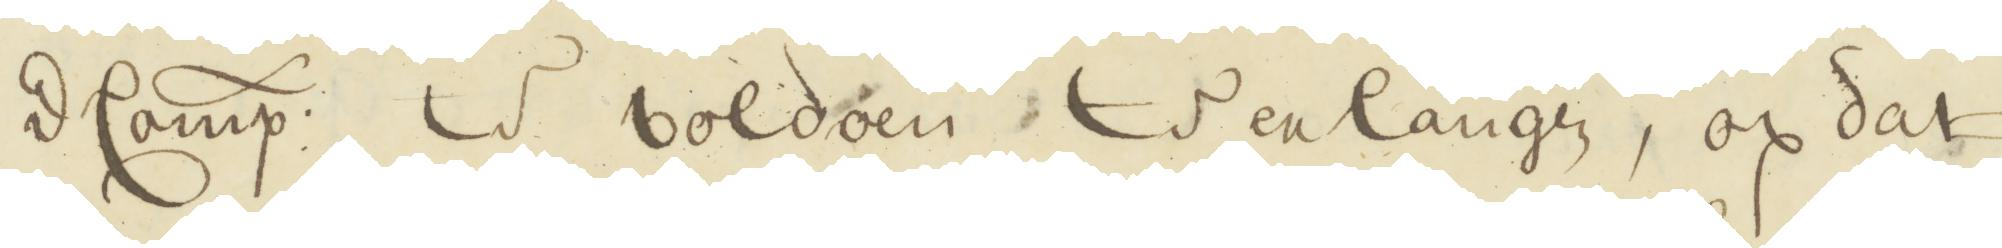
E Comp: te voldoen te erlangen, op dat
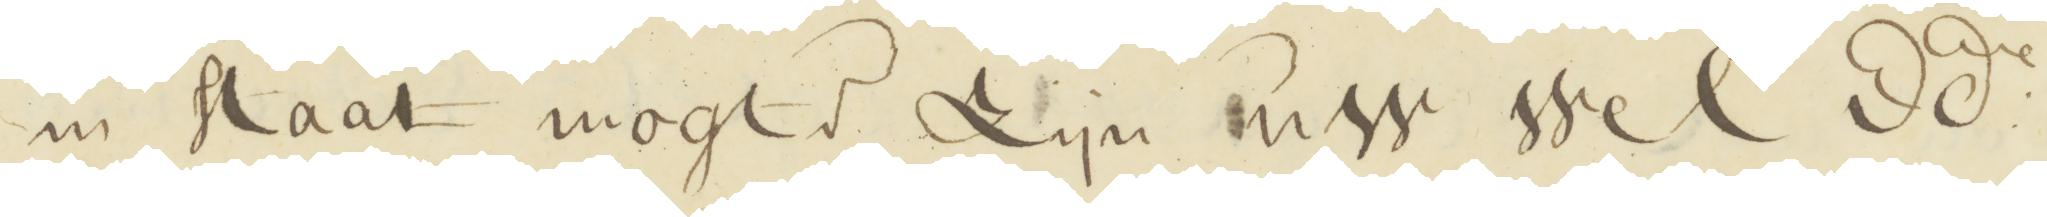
in staat mogte Zijn uw Wel Ed:e
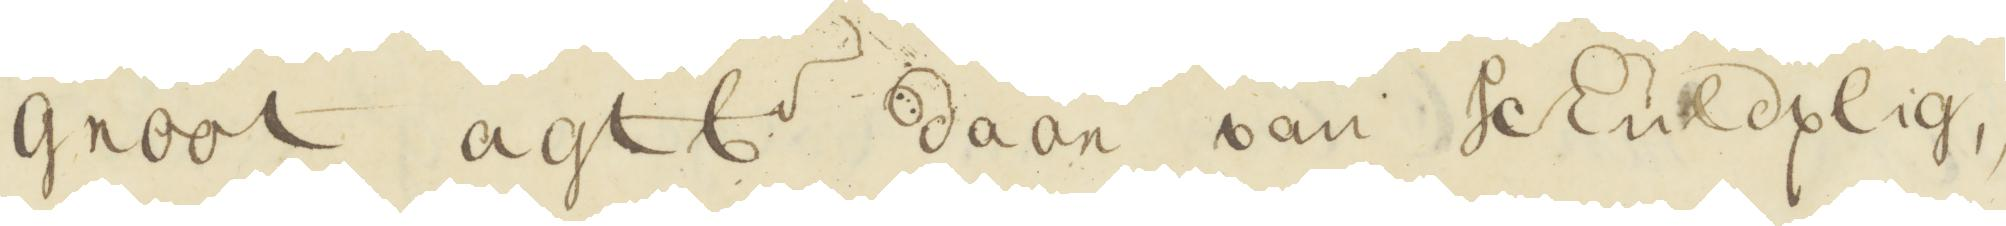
groot agtb:e daar van schuldplig„
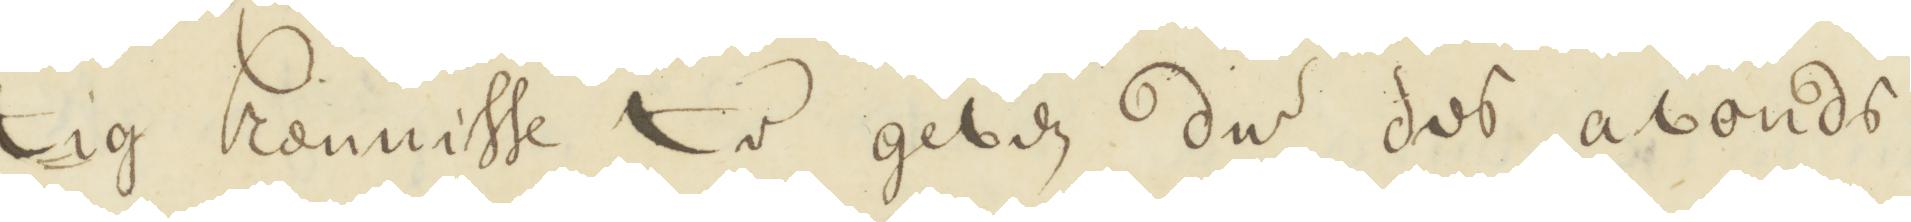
tig kennisse te geven die des avonds
